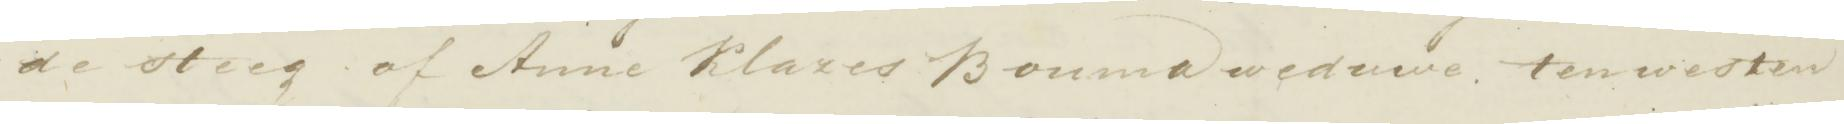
de steeg of Anne Klazes Bouma weduwe. ten westen
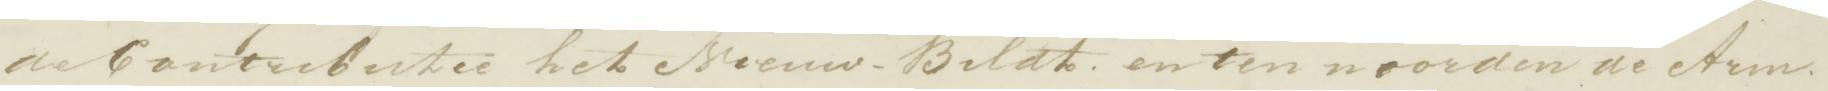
de contributie het Nieuw-Bildt. en ten noorden de Arm.
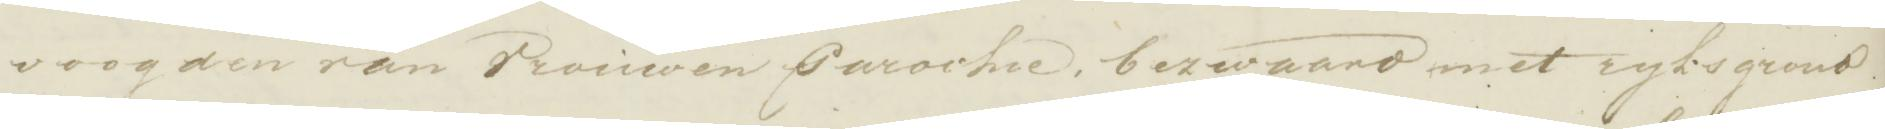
voogden van Vrouwen Parochie, bezwaard met ryksgrond
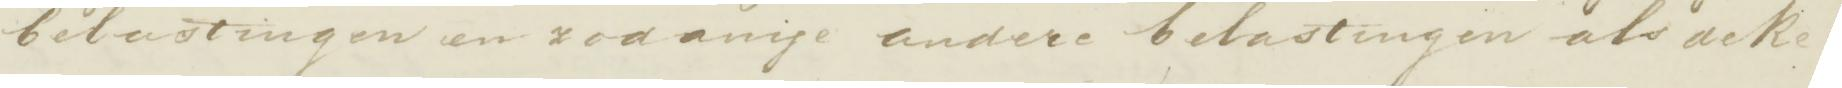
belastingen en zodanige andere belastingen als de Re
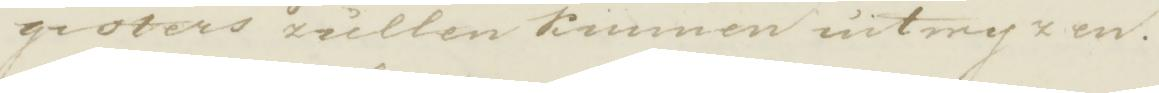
gisters zullen kunnen uitwyzen.
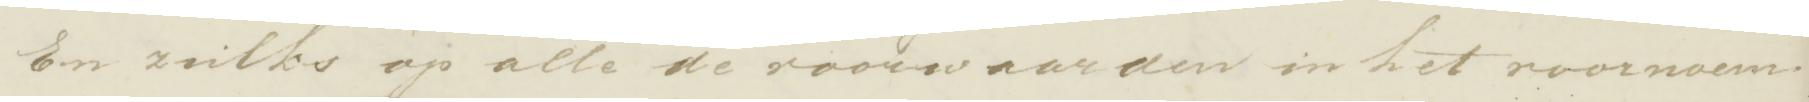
En zulks op alle de voorwaarden in het voornoem
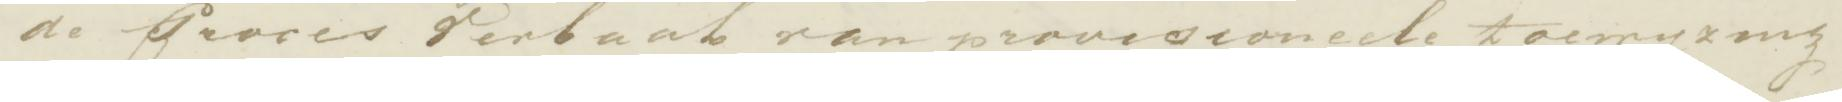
de Proces Verbaal van provisioneele toewyzing
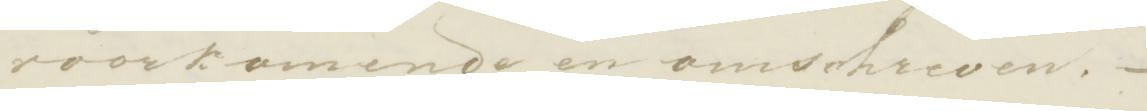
voorkomende en omschreven.
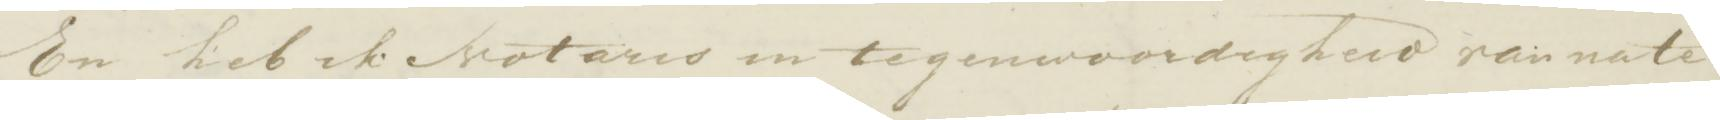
En heb ik Notaris in tegenwoordigheid van nate
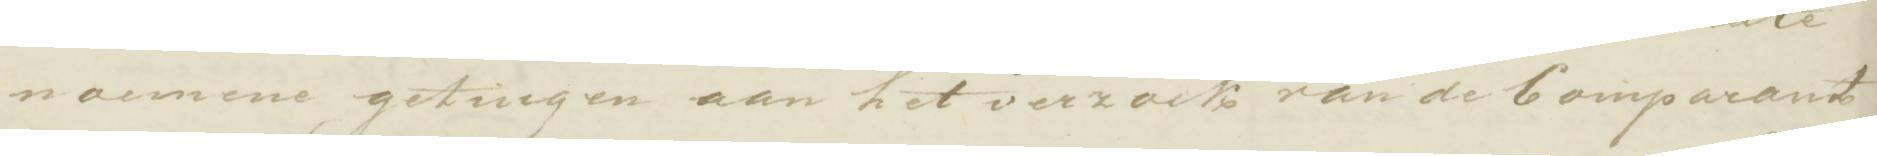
noemene getuigen aan het verzoek van de Comparant
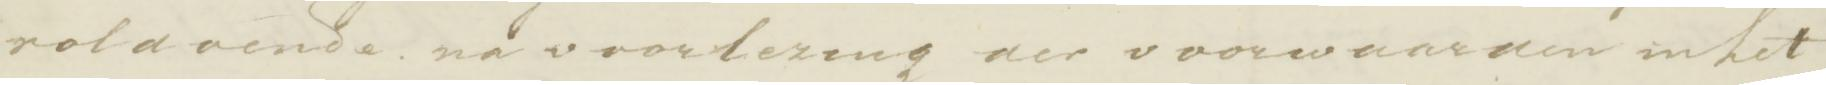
voldoende, na voorlezing der voorwaarden in het
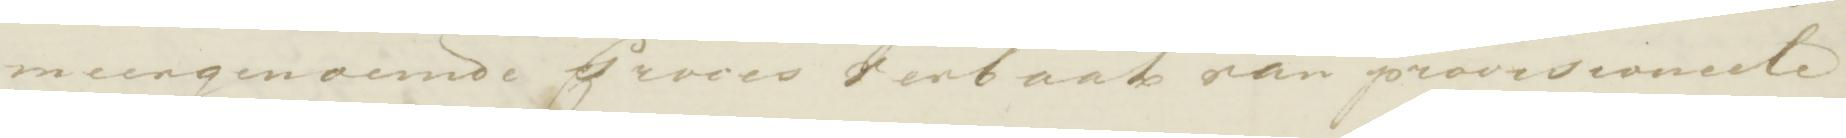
meergenoemde Proces Verbaal van provisioneele
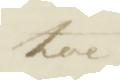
toe
